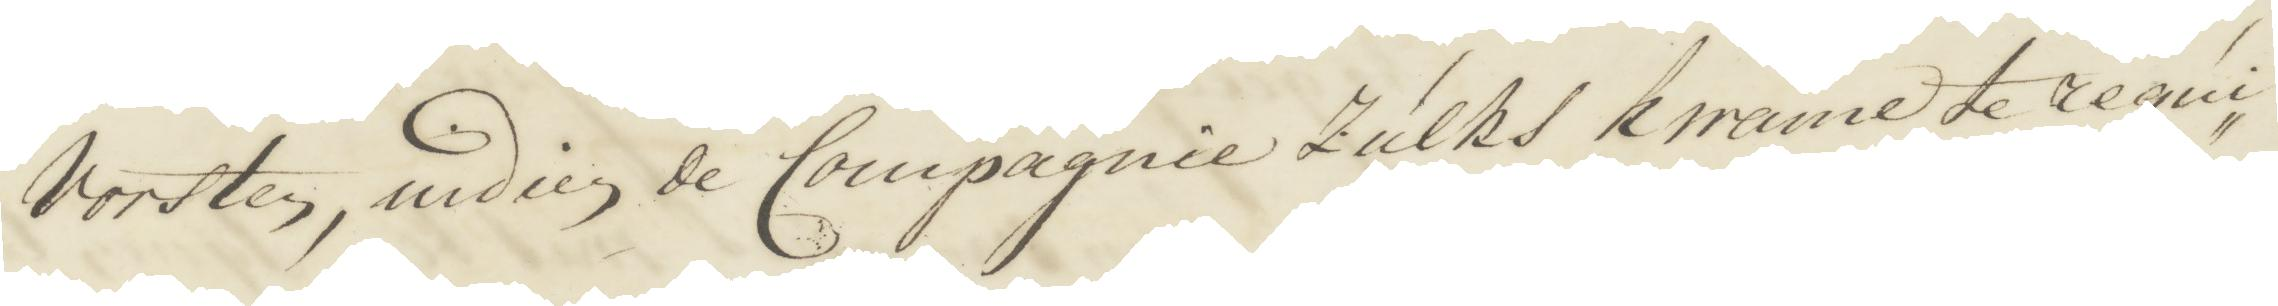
vorsten, indien de compagnie zulks kwame te requi„
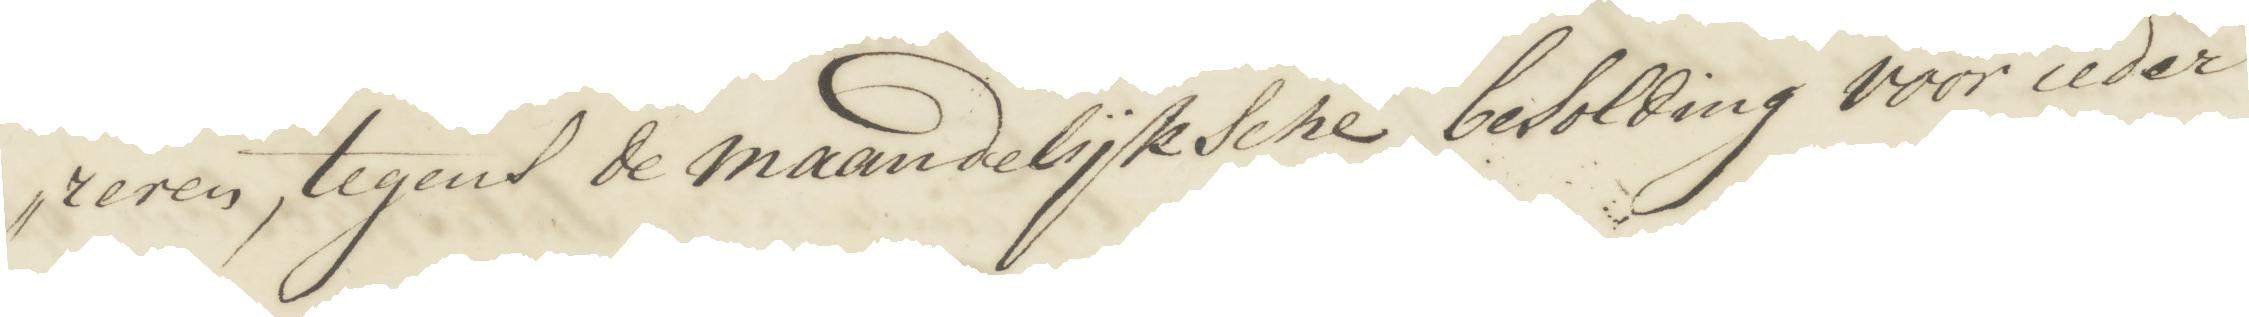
„reren, tegens de maandelijksche besolding voor ieder
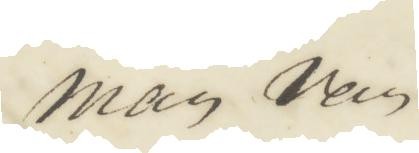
man van
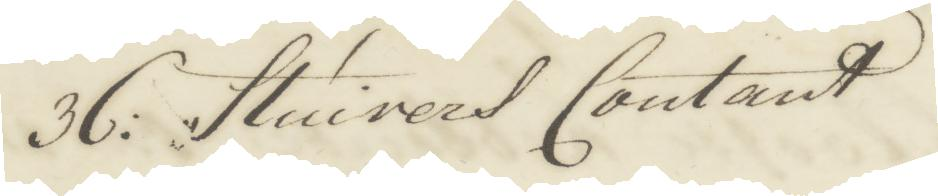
36: stuivers Contant
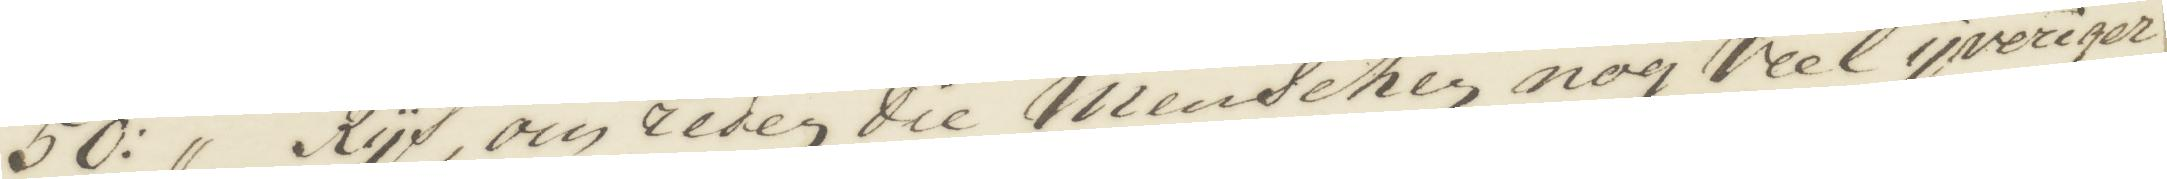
50: „ Rijs, om reden die menschen nog veel ijveriger,
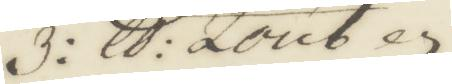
3: lb: zout en
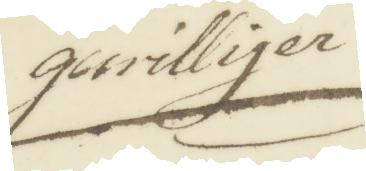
gewilliger
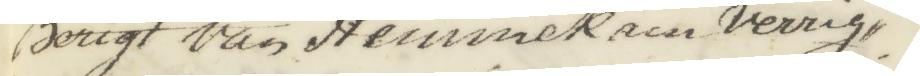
Berigt van Hemmekam verrig„
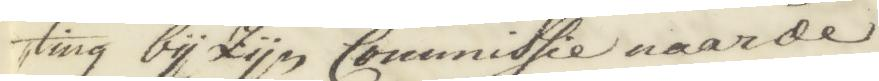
ting bij zijn Commissie naar de
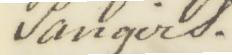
sangirs.
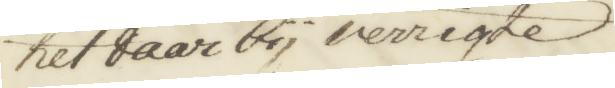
het daar bij verrigte
